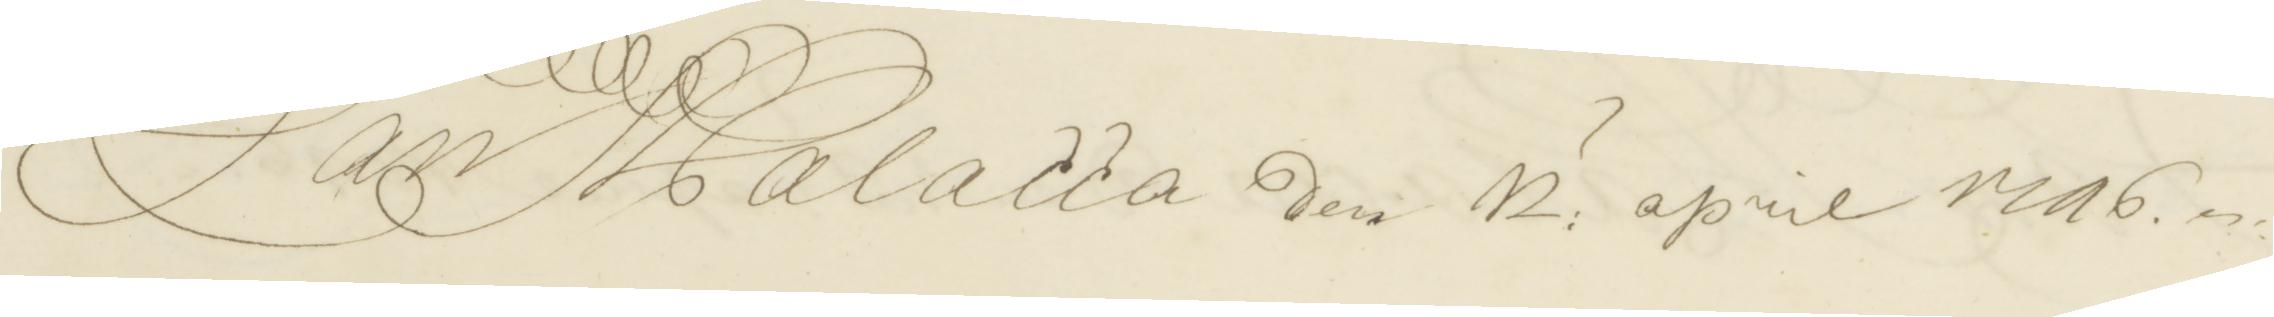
Van Malacca den 12:' april 1746.
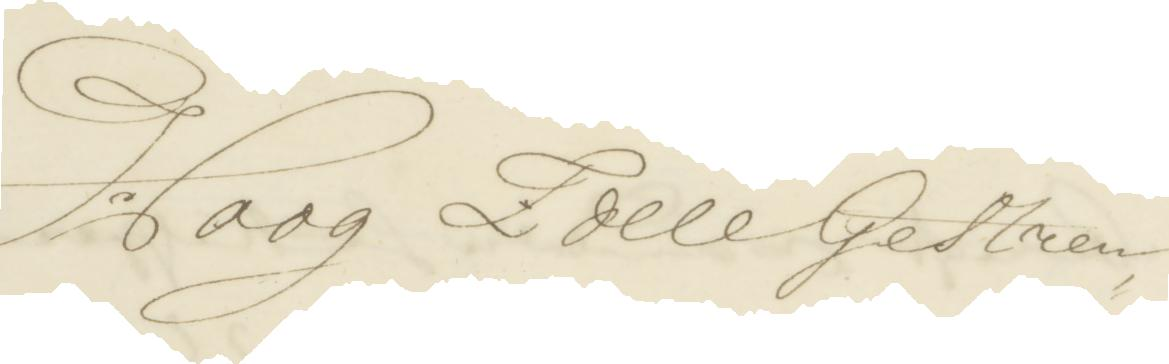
Hoog Edele Gestren„
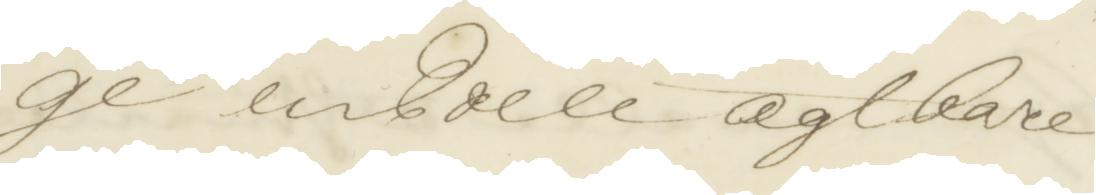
ge en Edele agtbare
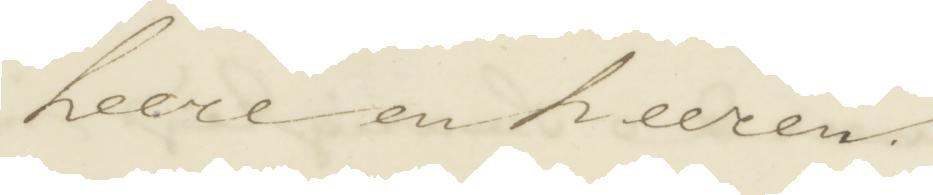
heere en heeren.
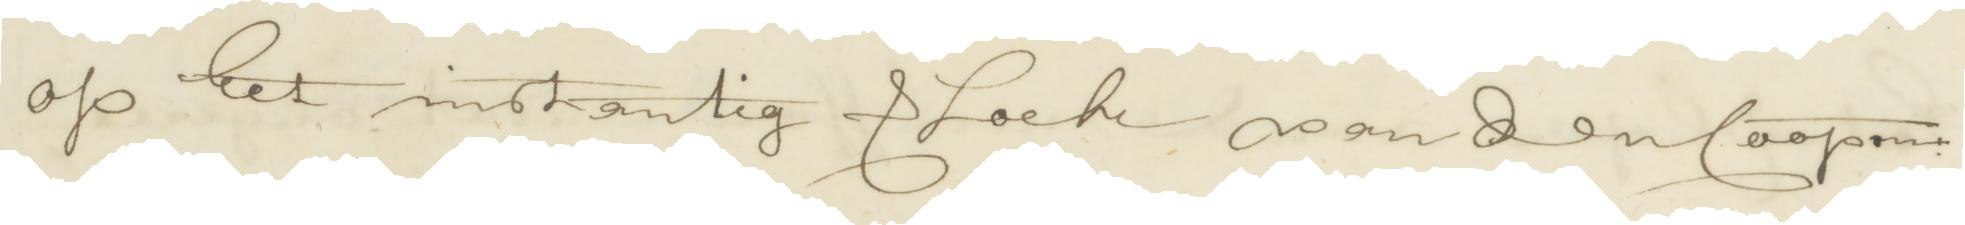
op het instantig versoek van den Coopm:
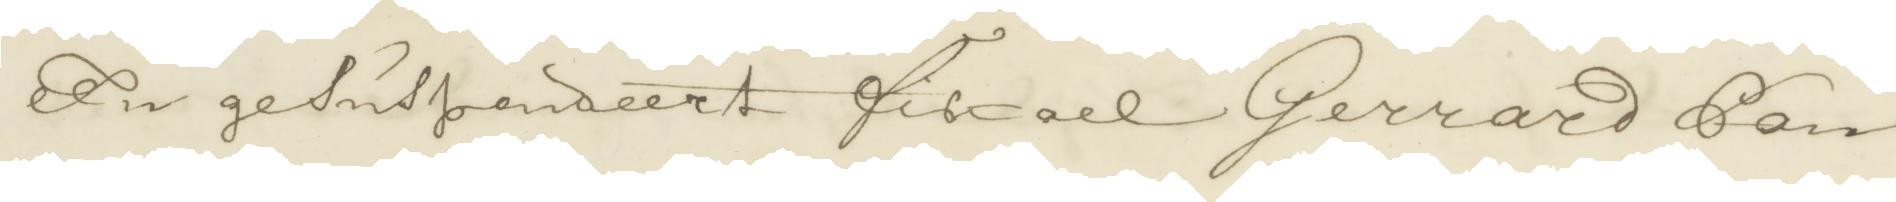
En gesuspendeert fiscael Gerrard Pan
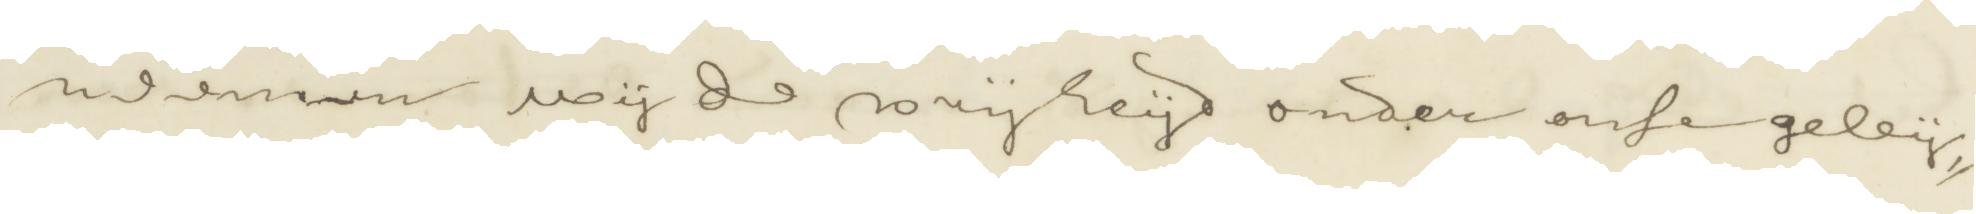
neemen wij de vrijheijd onder onse geleij„
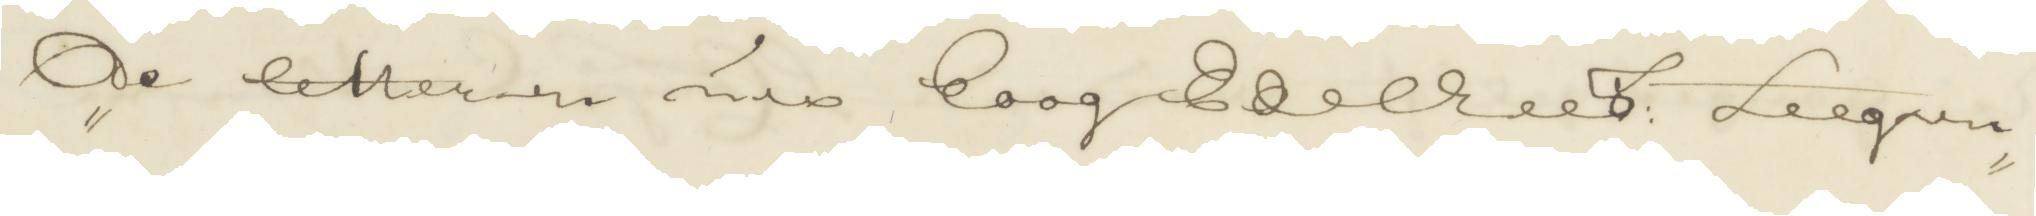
„de letteren uw hoog Edelheed:s teegen„
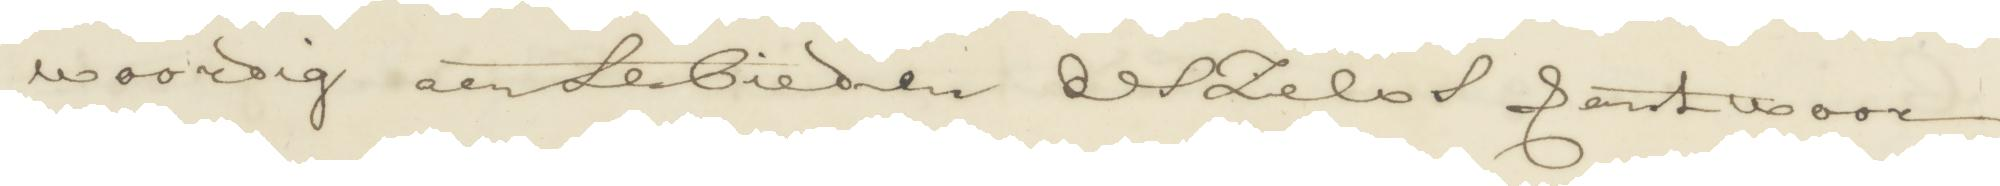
woordig aen te bieden deszelvs verantwoor
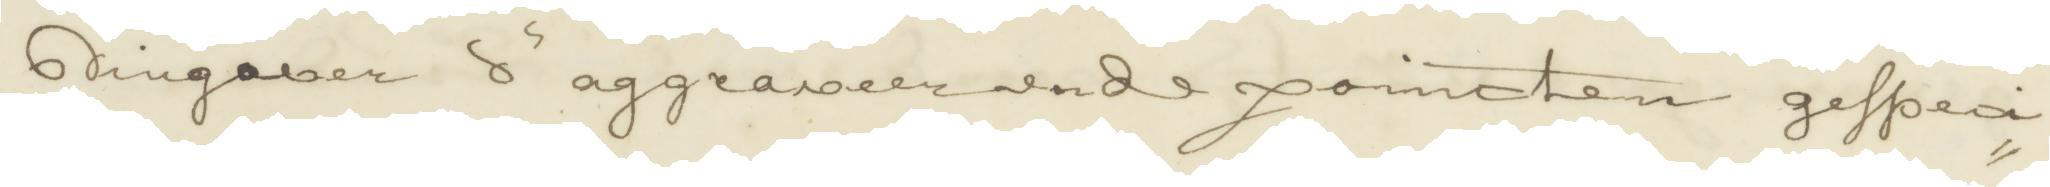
ding over d'aggraveerende poincten gespeci„
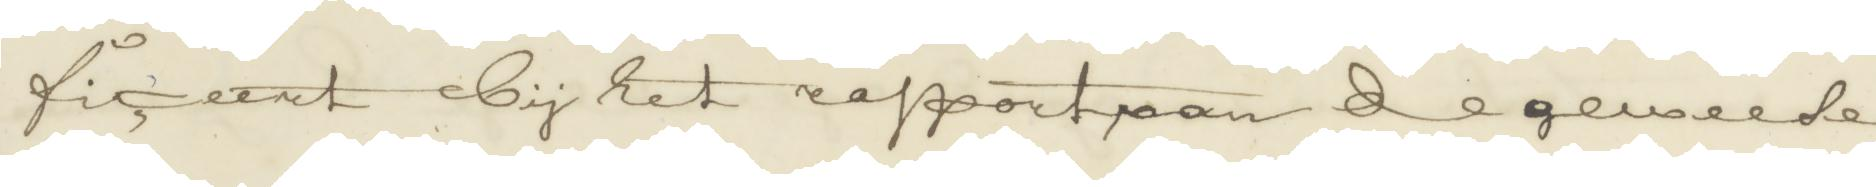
fiçeert bij het rapport van de geweese
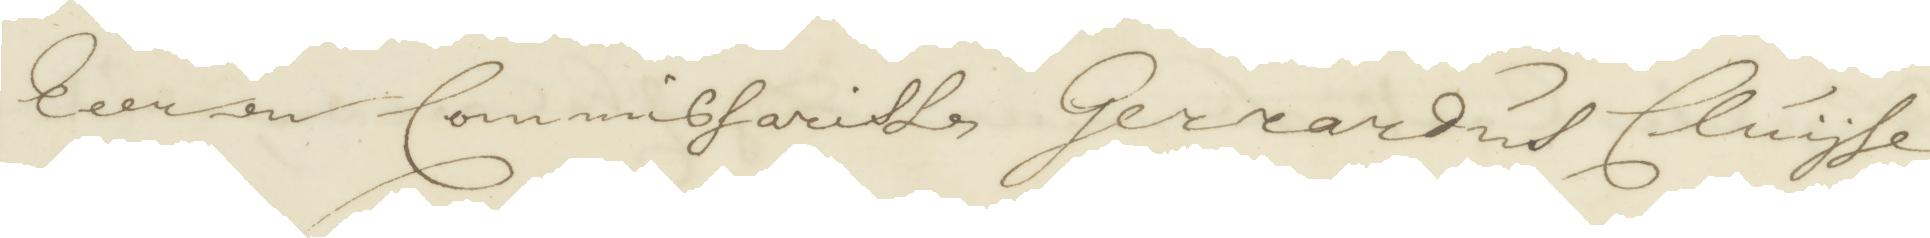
heeren Commissarissen Gerrardus Cluijse
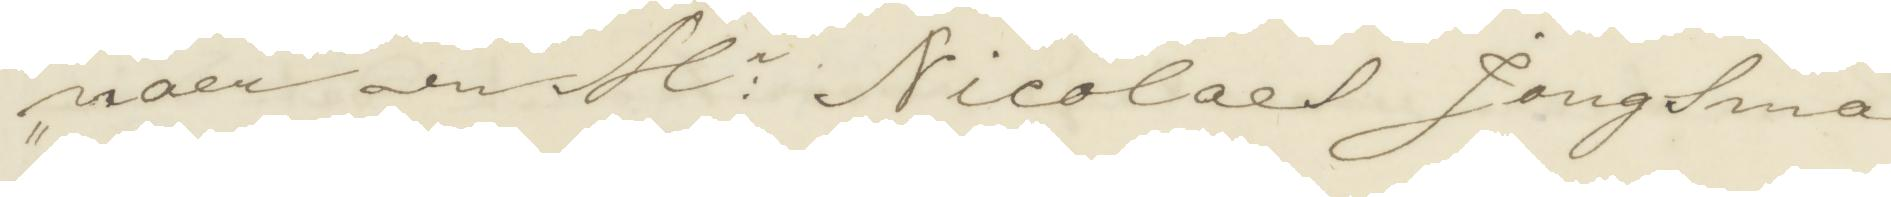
„naer en H:r Nicolaes Jongsma
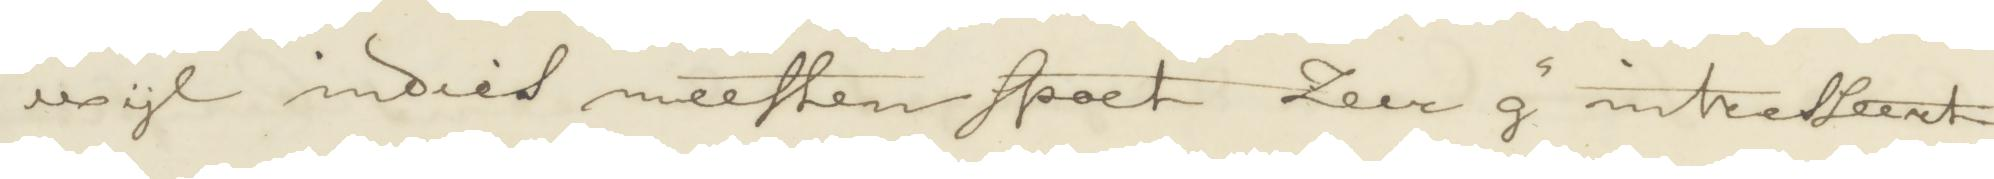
wijl indies meesten spoet zeer g'intresseert
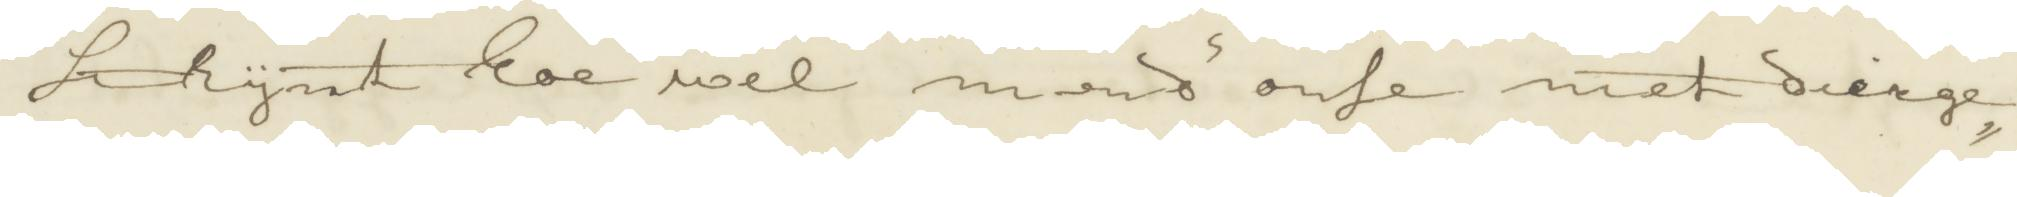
schijnt hoe wel men d' onse met dierge„
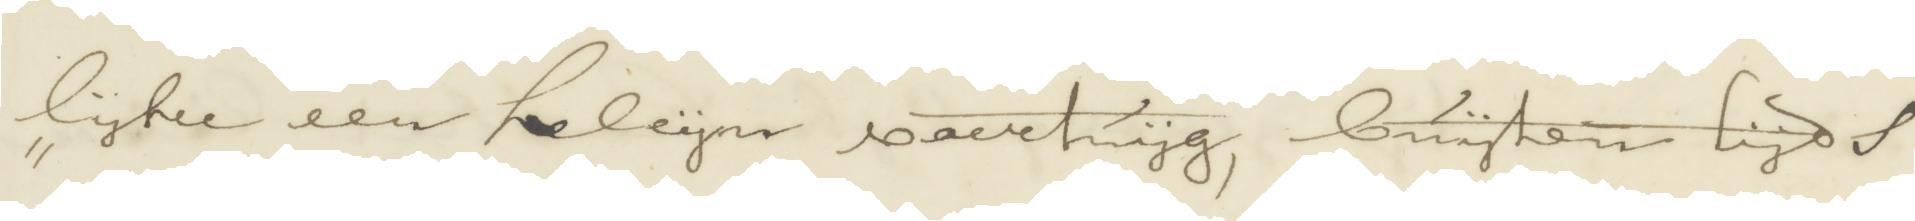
„lijke een kleijn vaertuijg, buijten tijds
